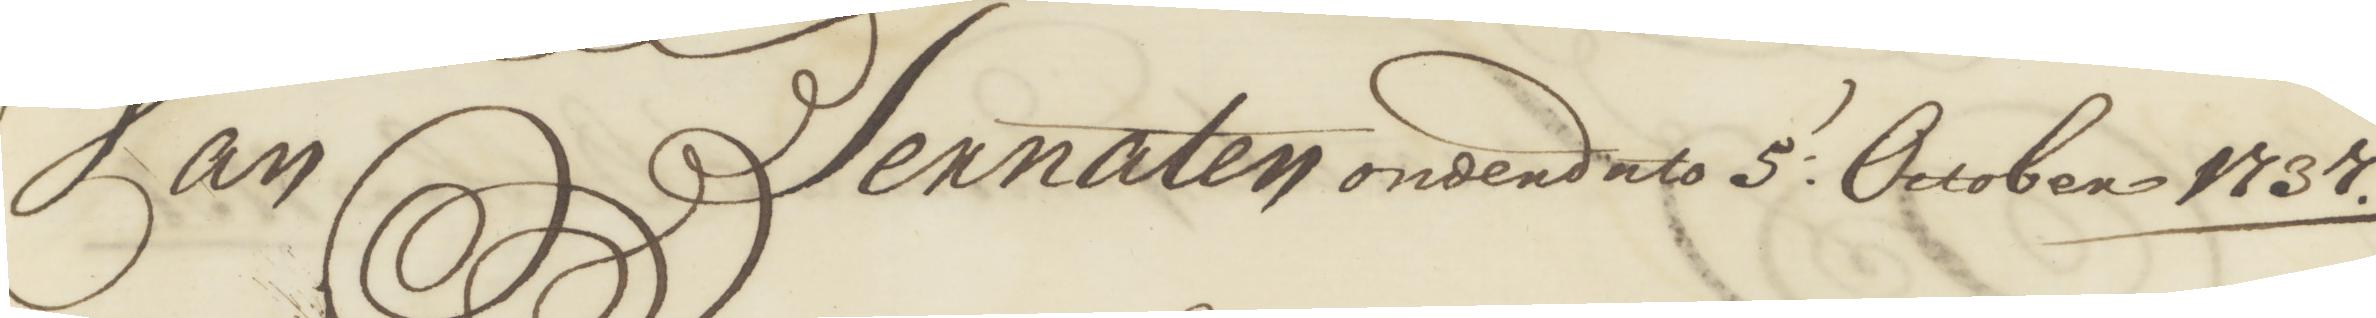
Van Ternaten onderdato 5:' October 1737.
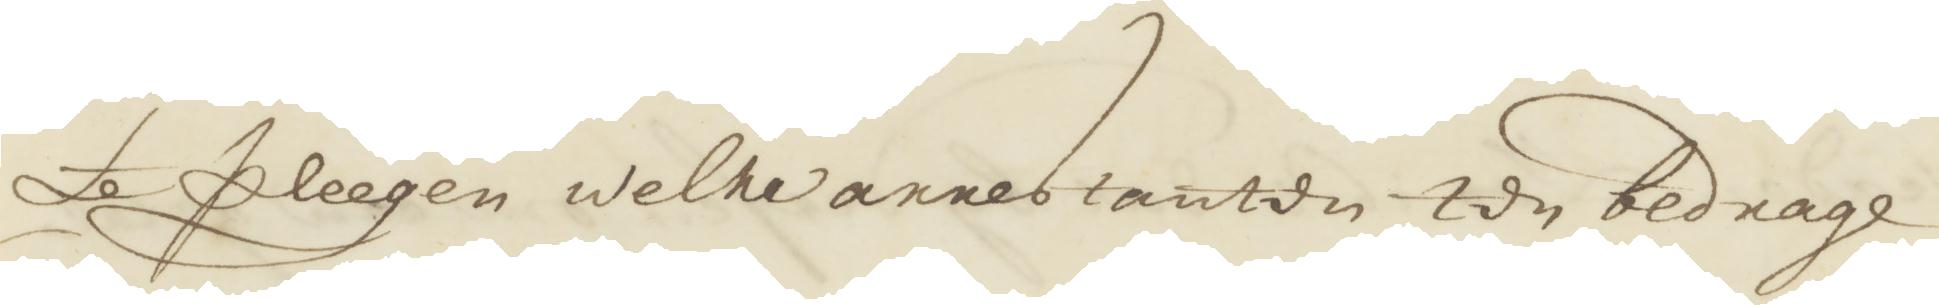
te pleegen welke arrestanten ten bedrage
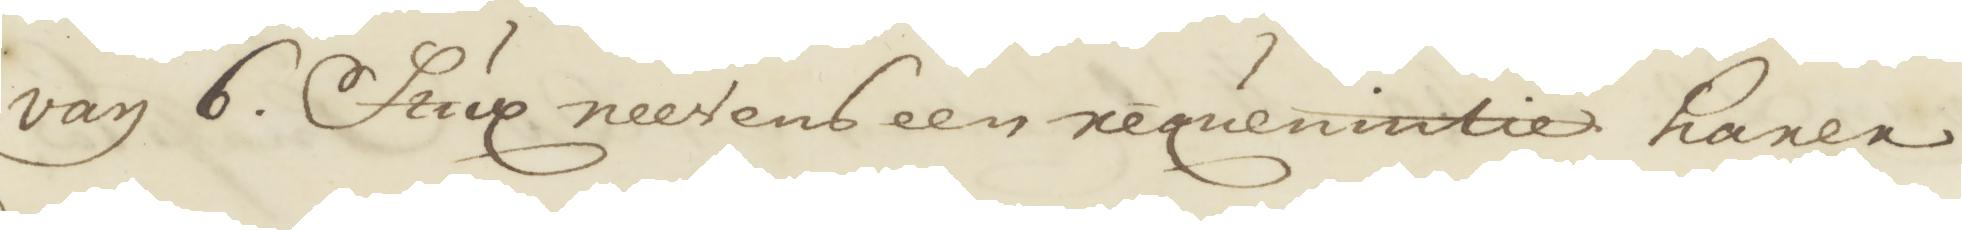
van 6. Stux neevens een requenintie harer
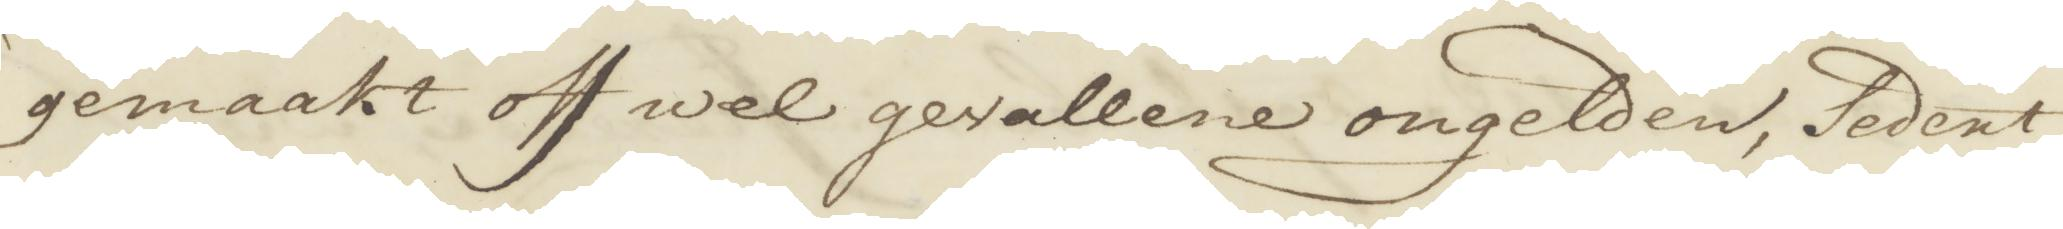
gemaakt off wel gevallene ongelden, sedert
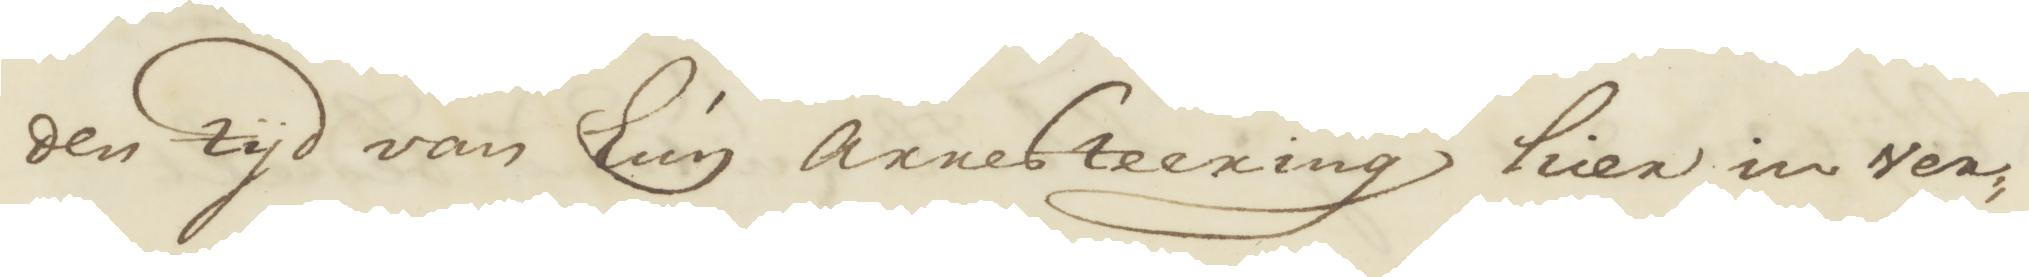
den tijd van hun arresteering hier in ver„
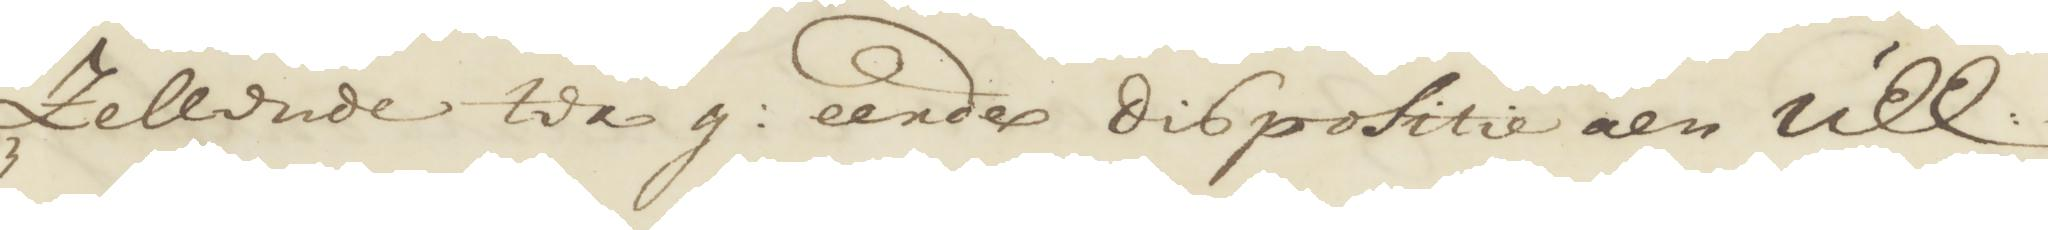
„zellende ter g: eerde dispositie aen uEE:
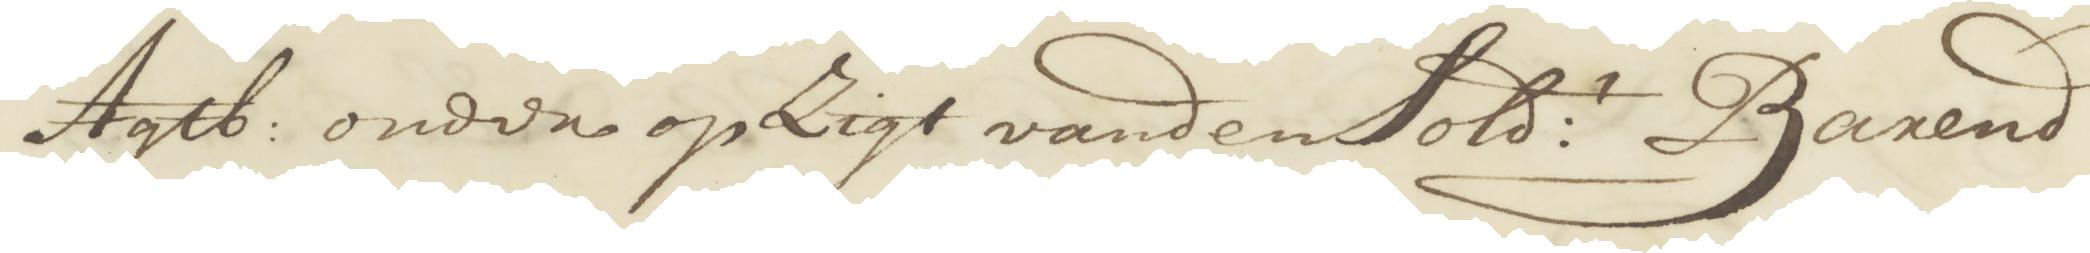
Agtb: onder opzigt van den Sold:t Barend
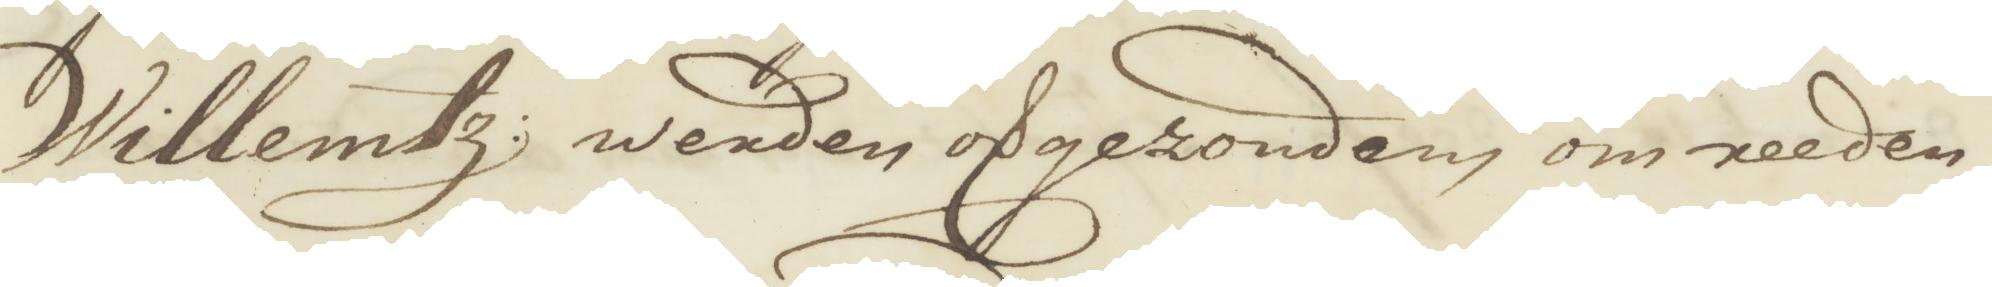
Willemsz: werden overgezonden, om reeden
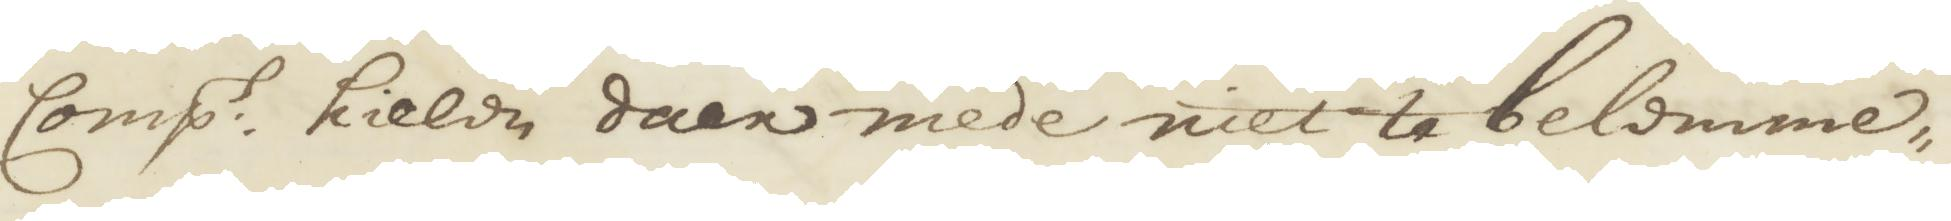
Comp:s kielen daer mede niet te belemme„
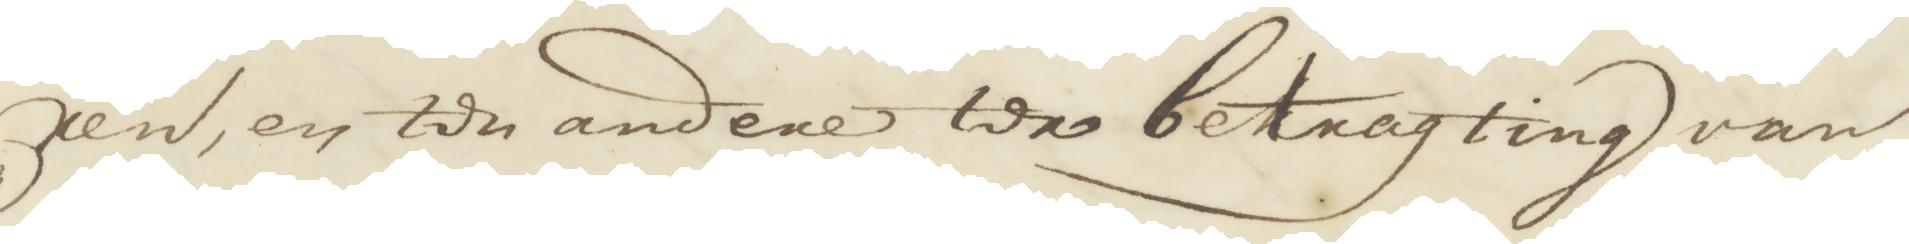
ren, en ten andere ter betragting van
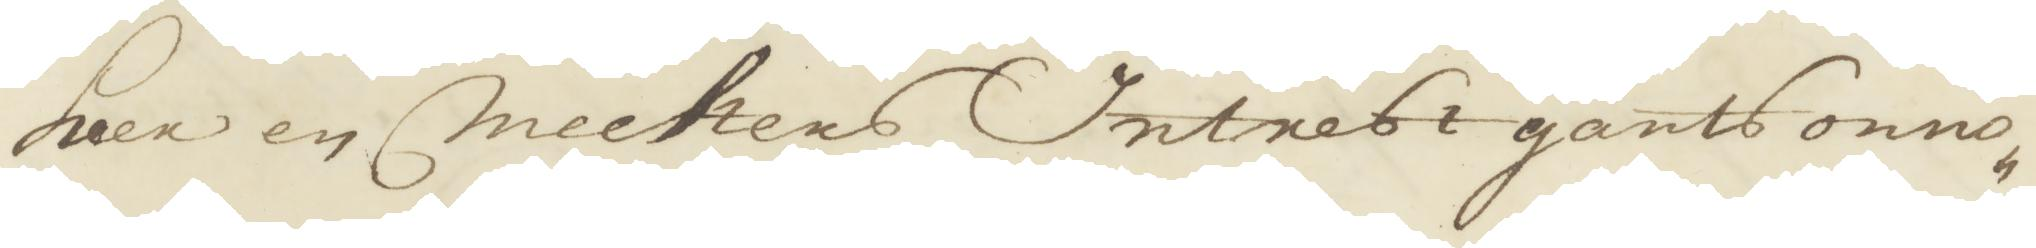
heer en meesters Intrest gants onno„
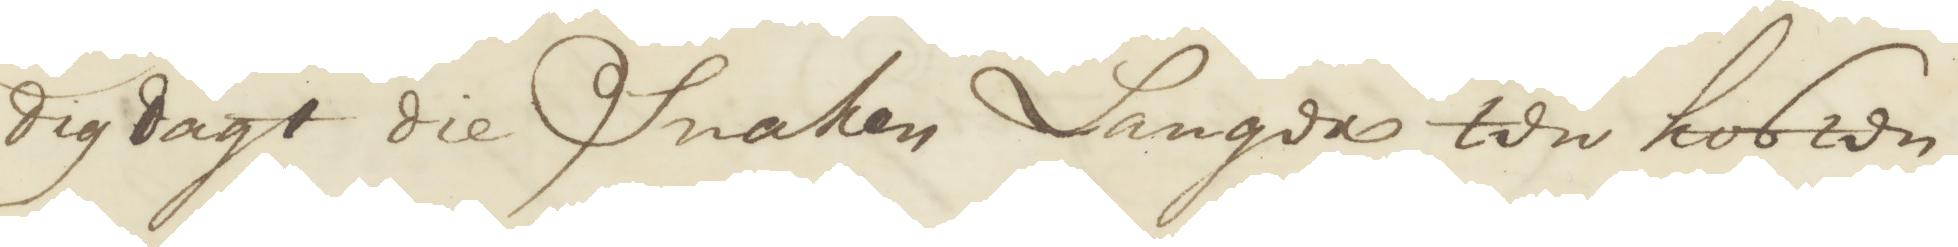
dig dagt die snaken Langer ten kosten
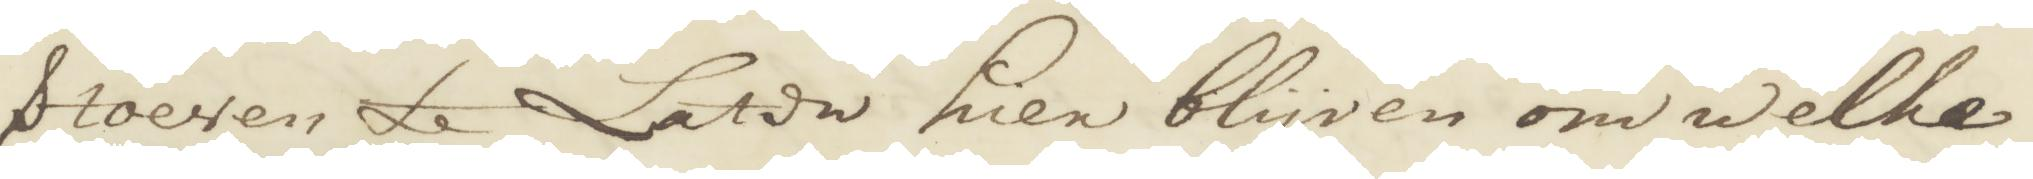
vertoeven te Laten hier blijven om welke
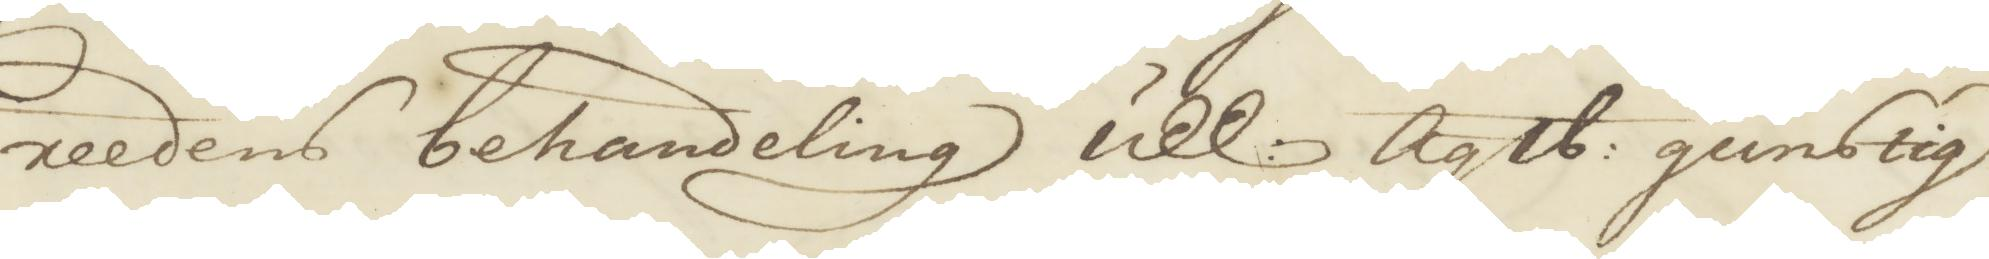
reedens behandeling uEE: Agtb: gunstig
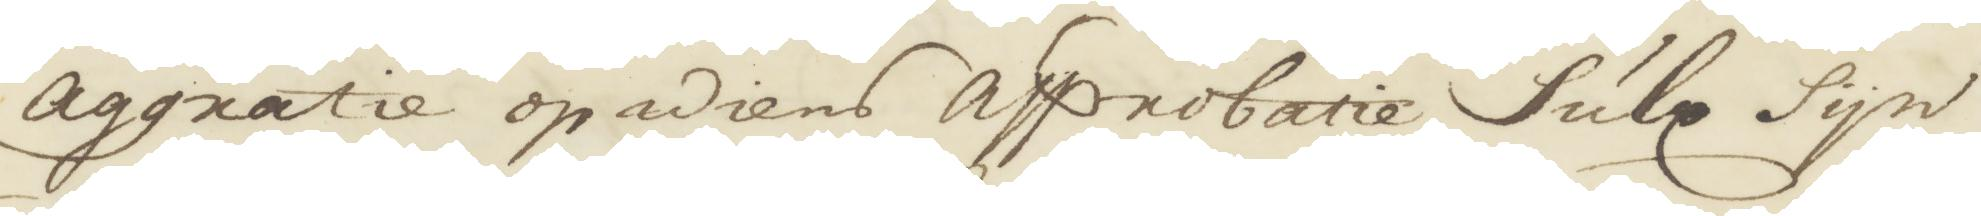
aggratie op wiens approbatie sulx sijn
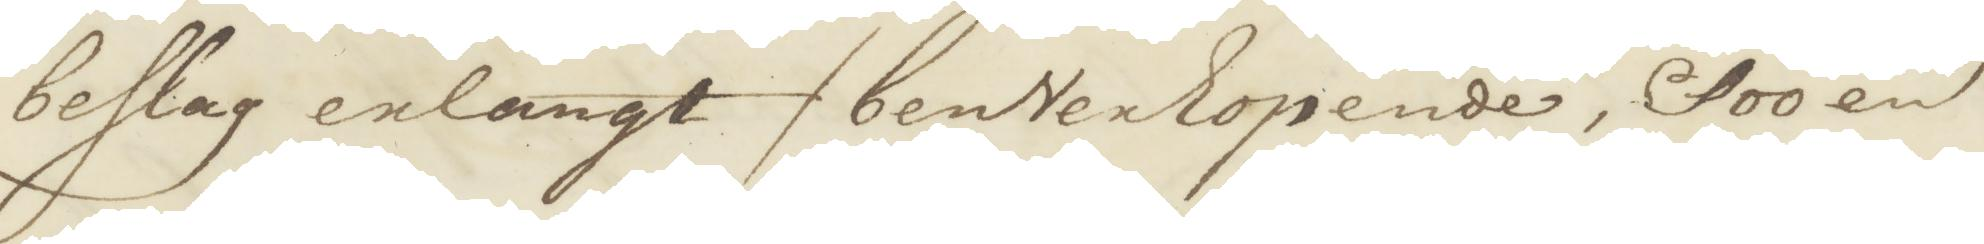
beslag erlangt / ben verhopende, soo en
